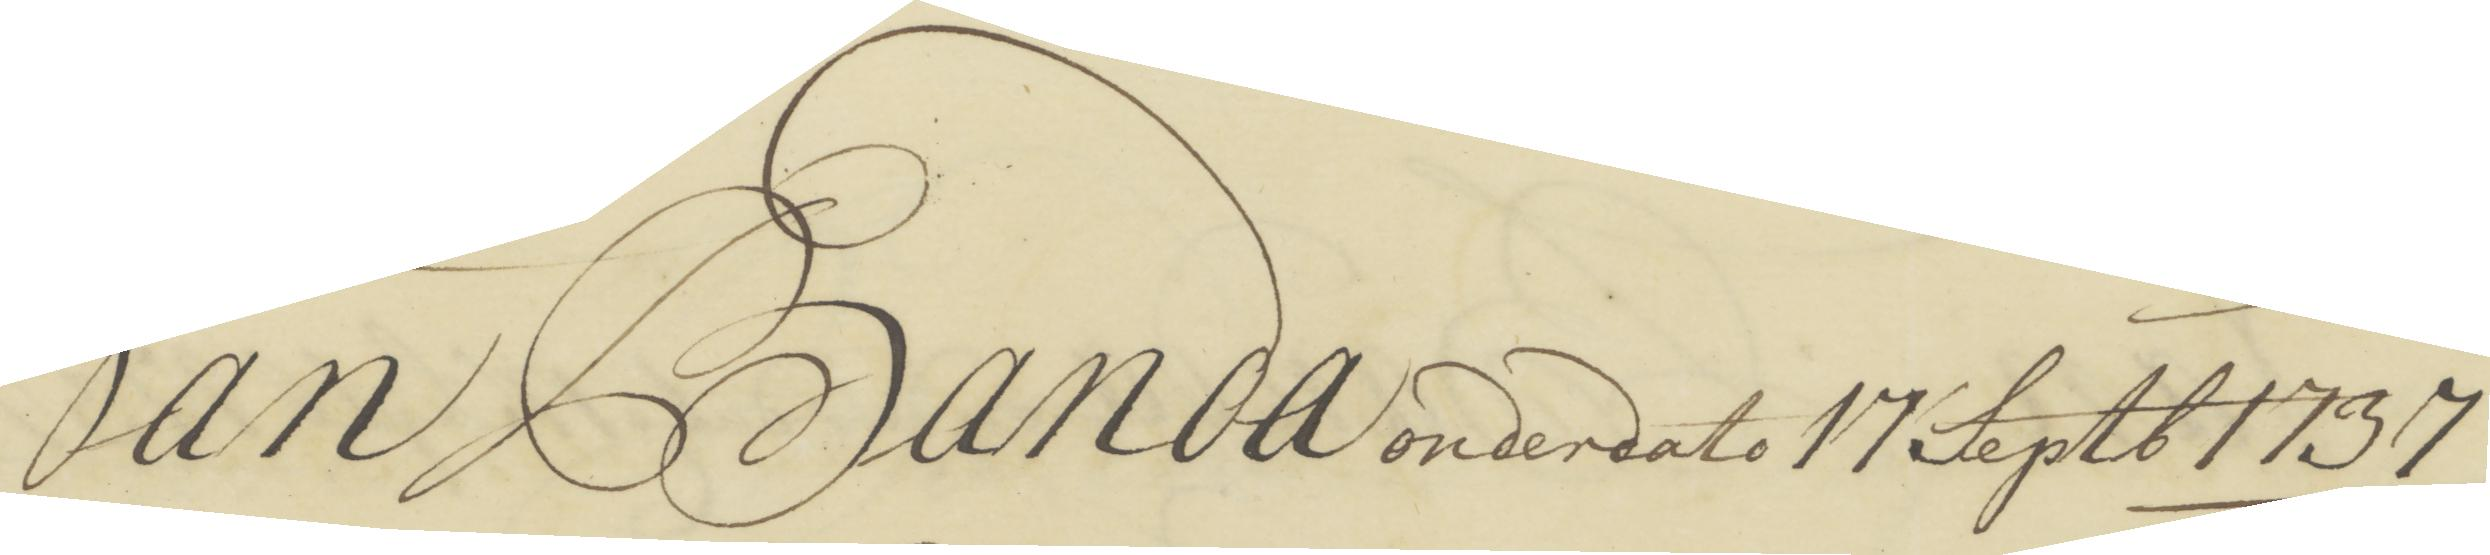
Van Banda onderdato 17 Septb 1737
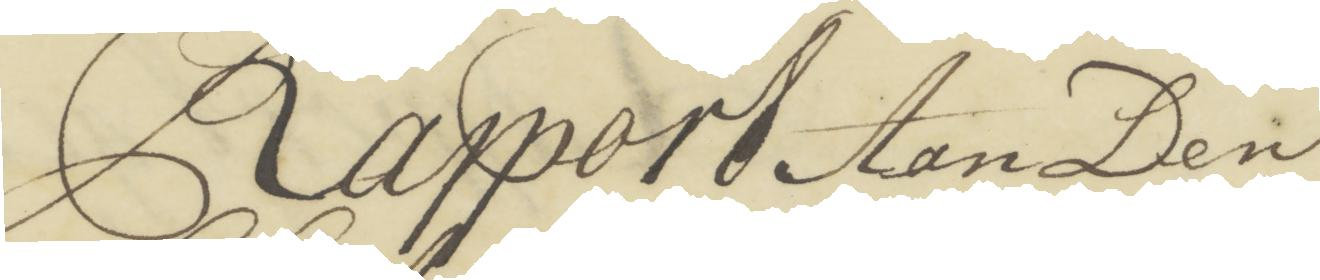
Rapport Aan Den
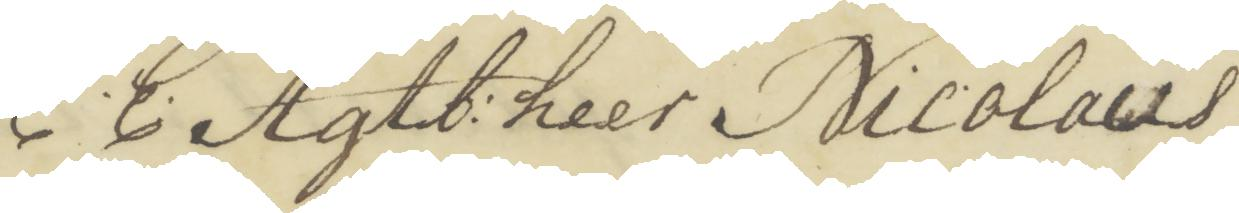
E: E: Agtb: heer Nicolaus
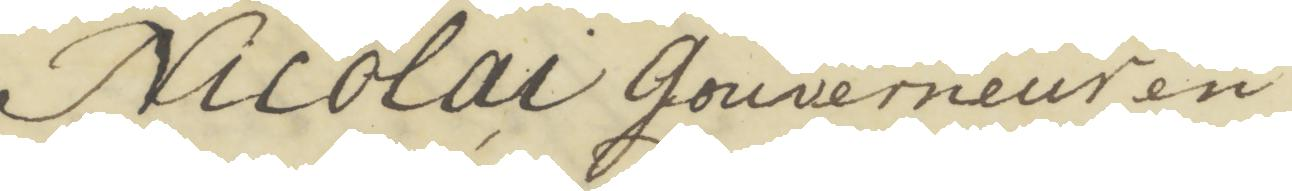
Nicolai Gouverneur en
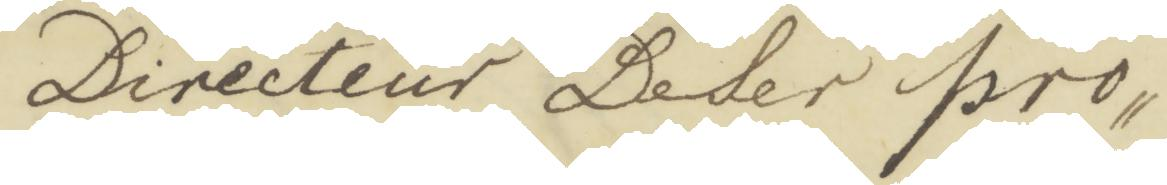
Directeur Deser Pro„
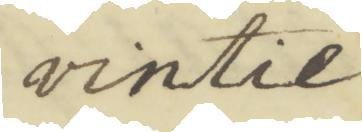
vintie
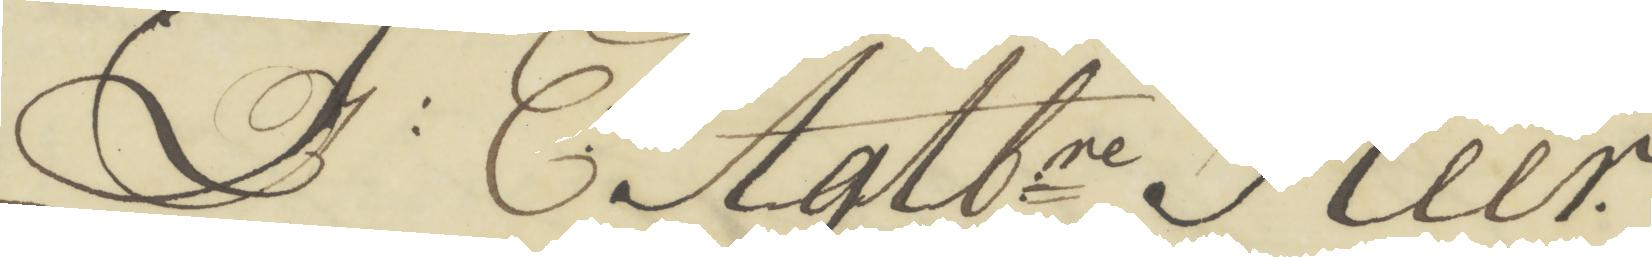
T: E: Agtb=re Heer.
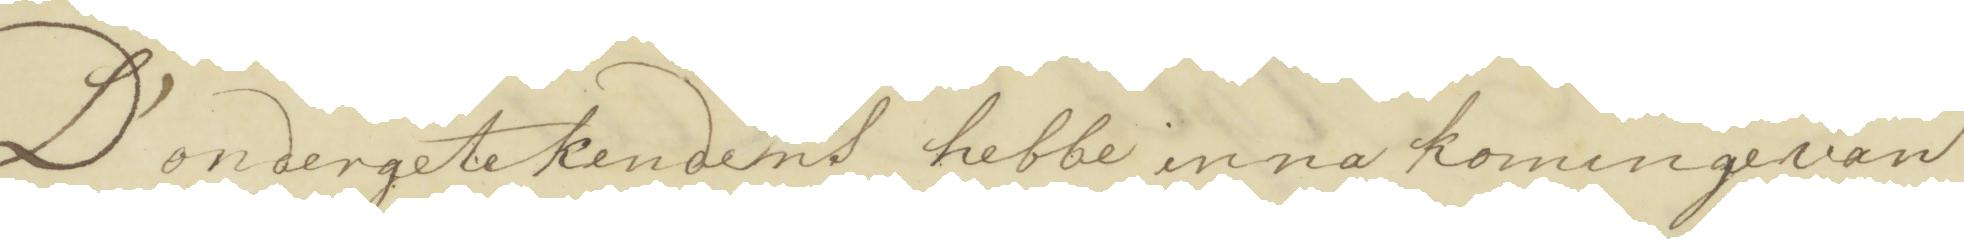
D'ondergetekendens hebbe in na kominge van
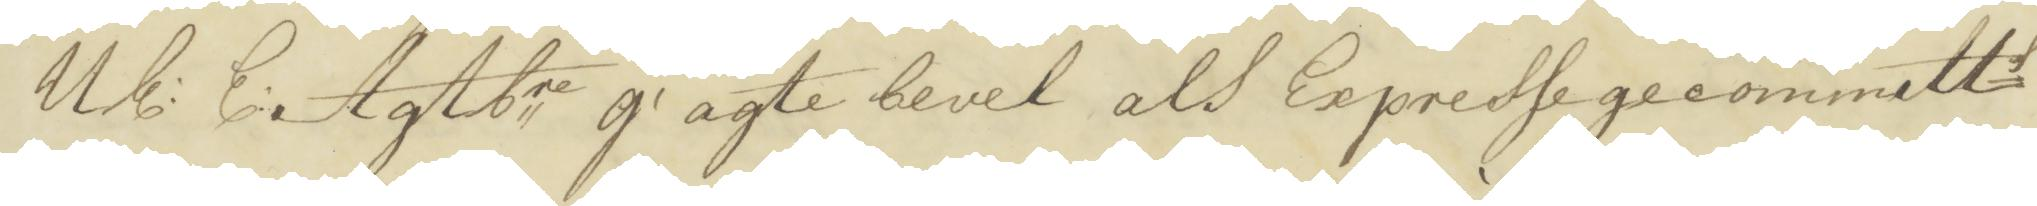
UE: E: Agtb„re g’agte bevel als Expresse gecommitt=s
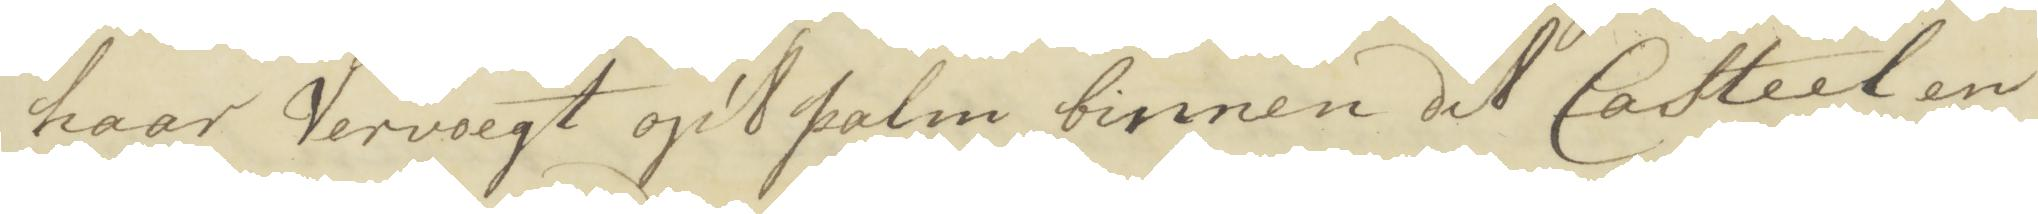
haar Vervoegt op 's palm binnen dit Casteel en
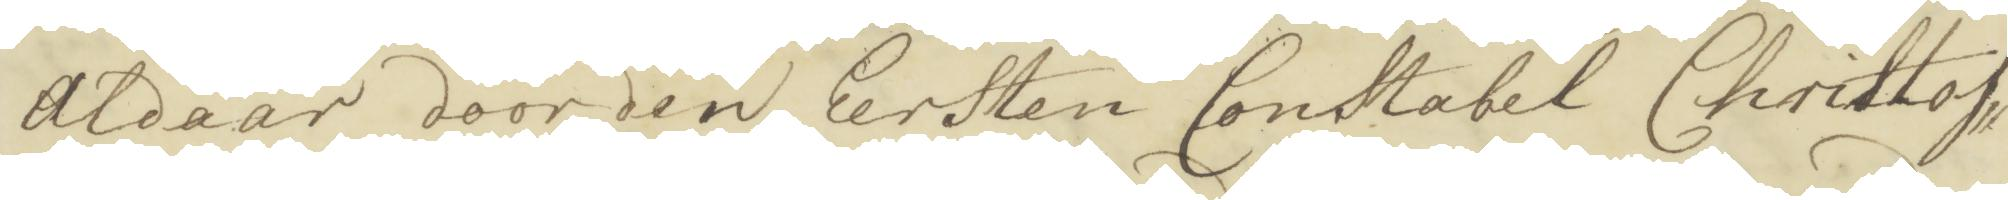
Aldaar door den Eersten Constabel Christof„
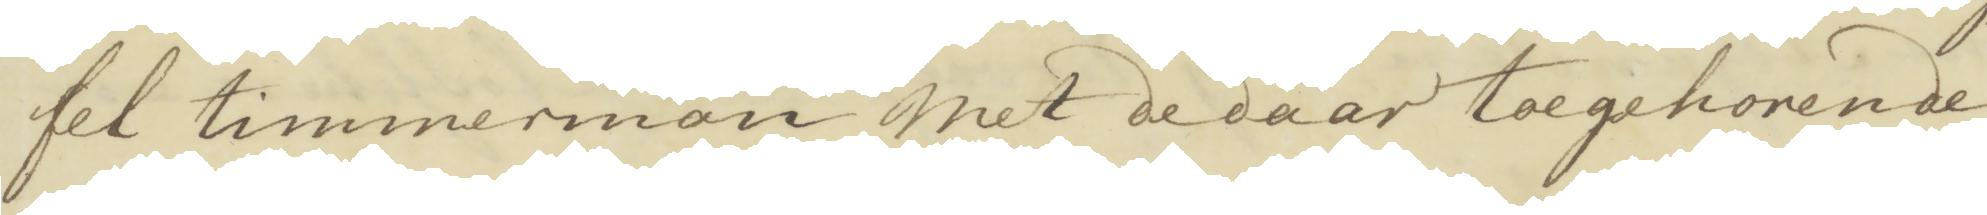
fel timmerman met dedaar toegehorende
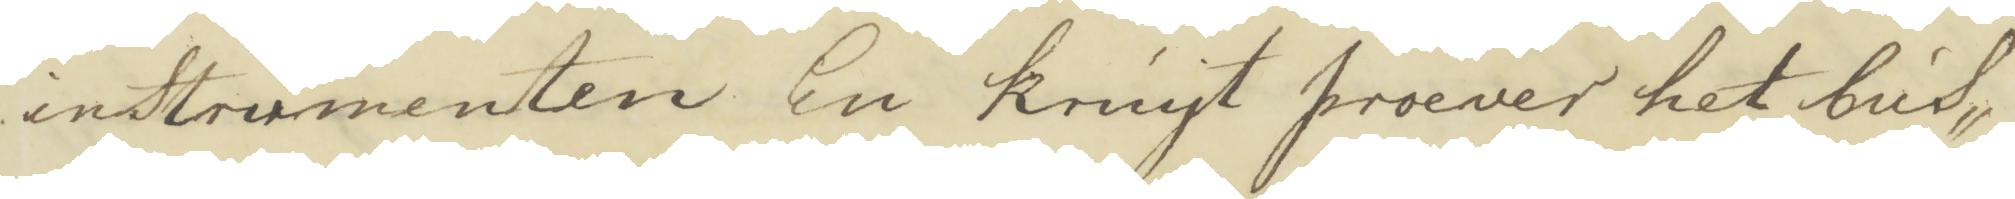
instrumenten En kruijt proever het bus„
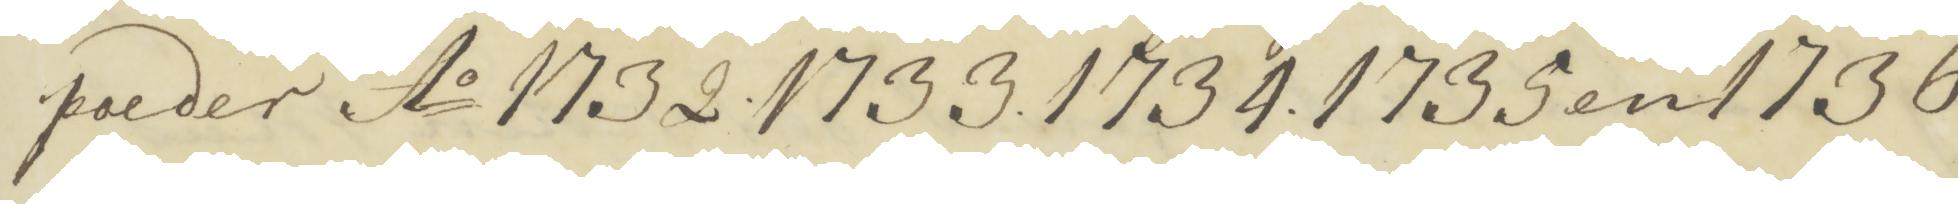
poeder A=o 1732.1733.1734.1735 en 1736
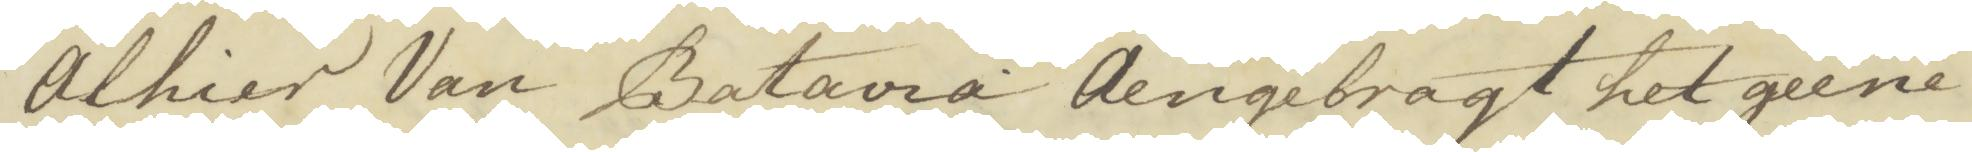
Alhier Van Batavia Aengebragt het geene
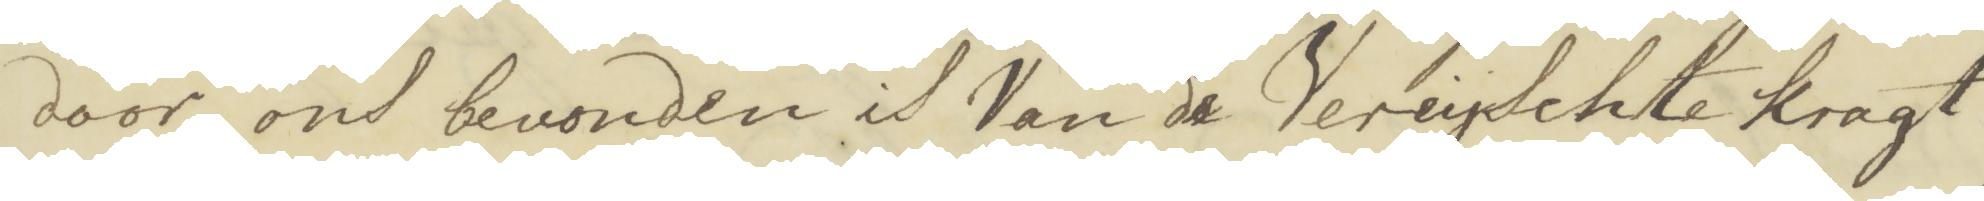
door ons bevonden is Van de Vereijschte kragt
